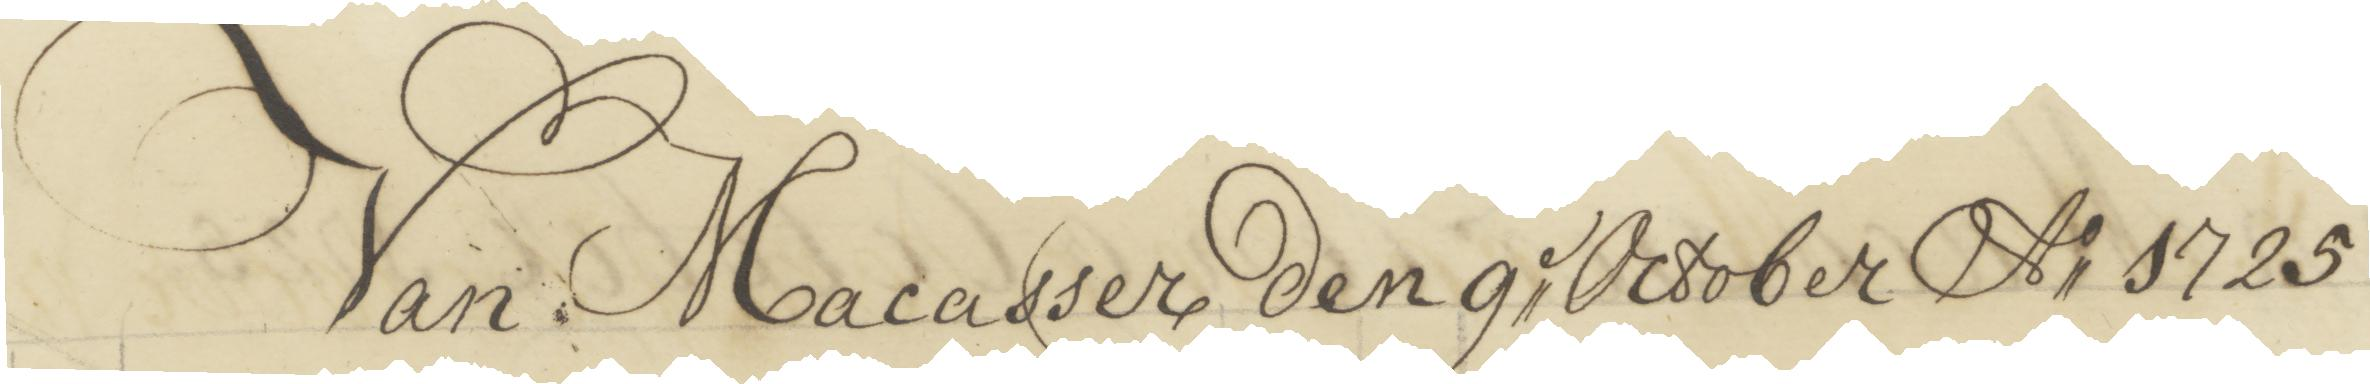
Van Macasser den 9„e October A=o 1725
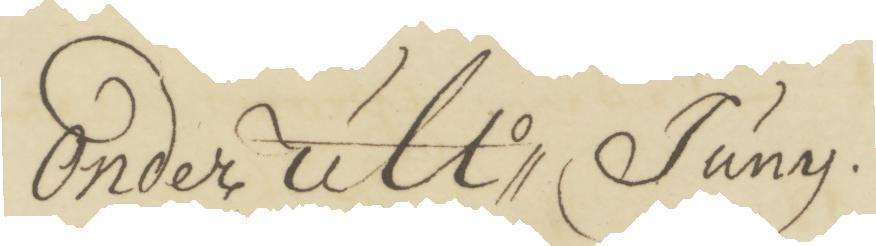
onder ult„o Iuny.
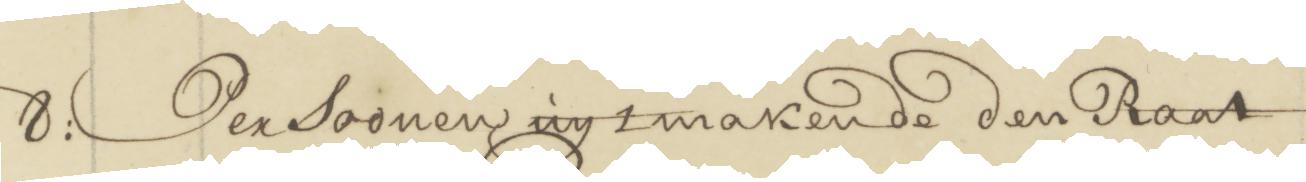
8: Persoonen uytmakende den Raat
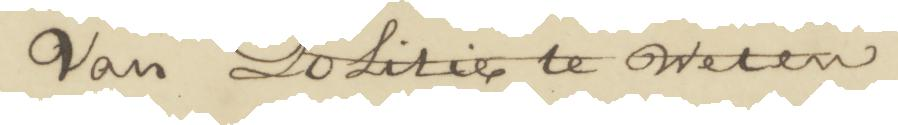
van Politie te weten
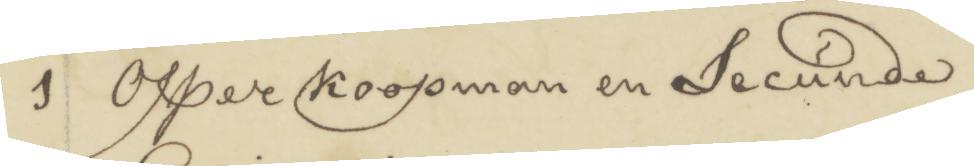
1 Opper koopman en secunde
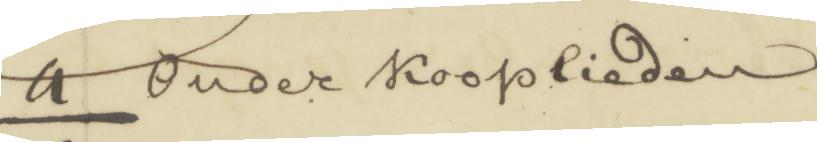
4 Onder kooplieden
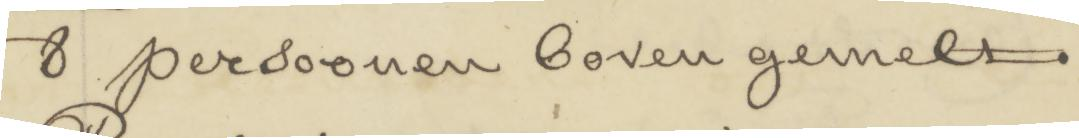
8 persoonen boven gemelt
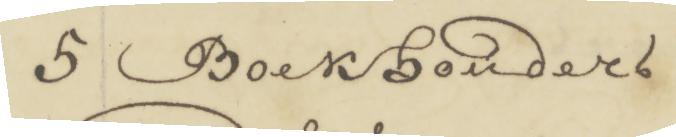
5 Boekhouders
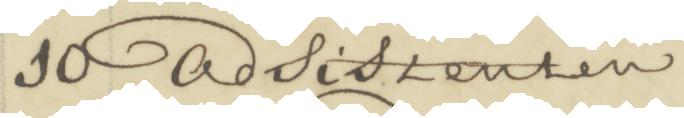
10 adsistenten
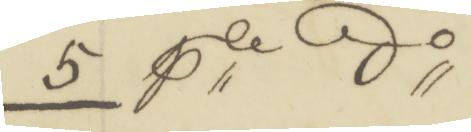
5 p„le d„o
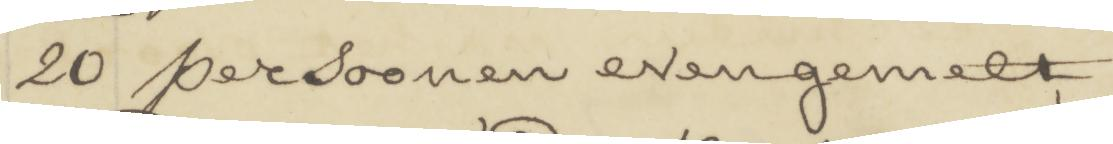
20 persoonen evengemelt
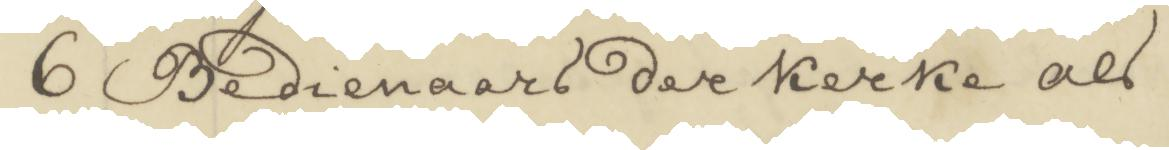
6 Bedienaars der kerke als
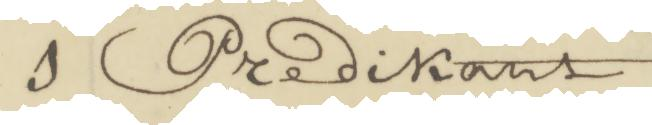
1 Predikant
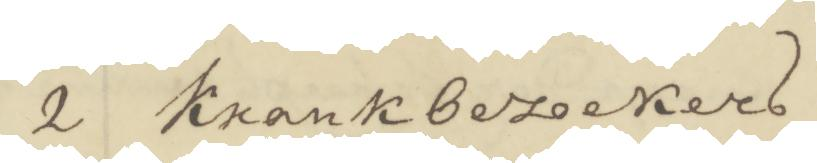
2 krankbezoekers
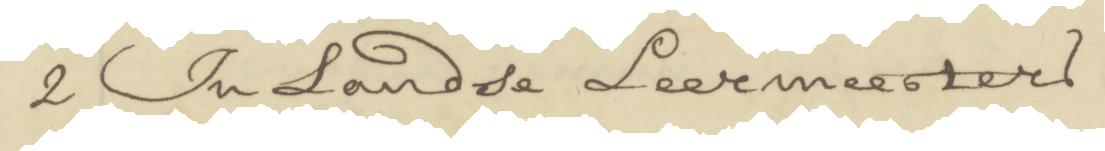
2 Inlandse Leermeesters
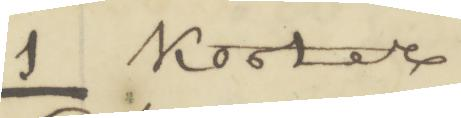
1 koster
